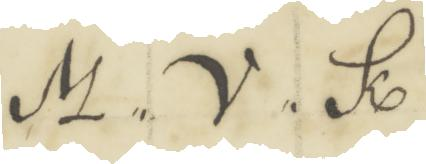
M„ V„ K
